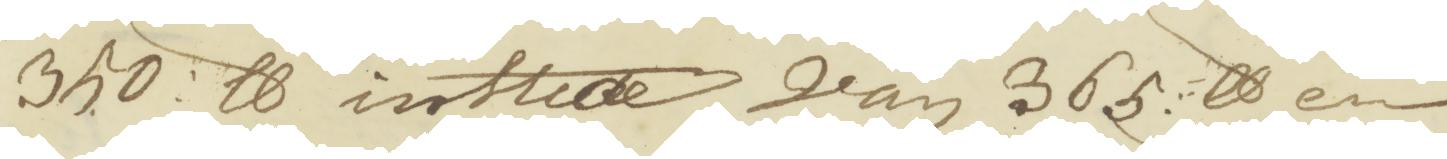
350: lb instede van 365: lb en
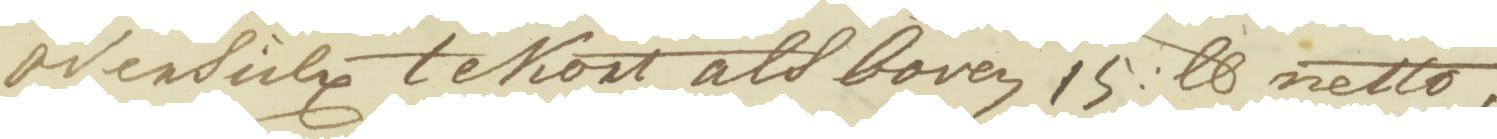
oversulx tekort als boven 15: lb netto,
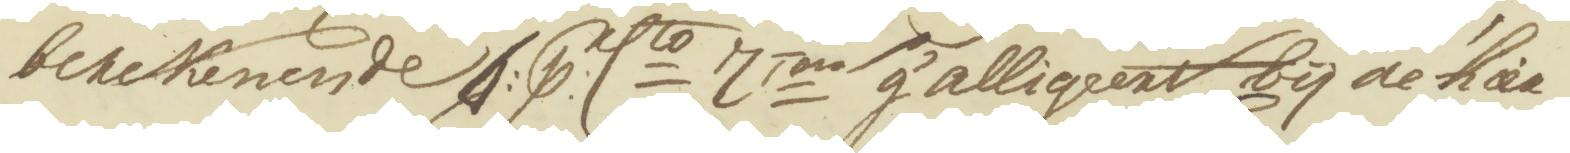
betekenende 4: p:r C=to r=tm g' alligeert bij de hier
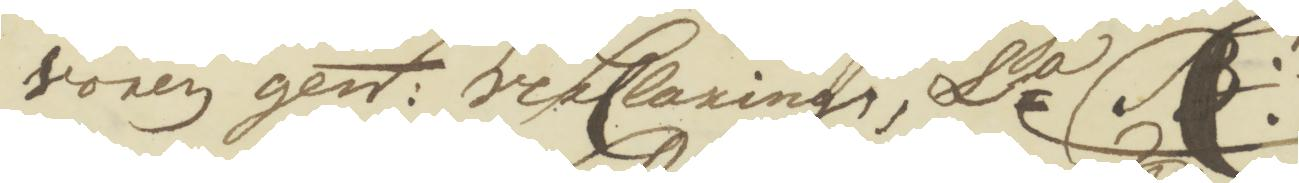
voren gen: verClaringe, L=a C:
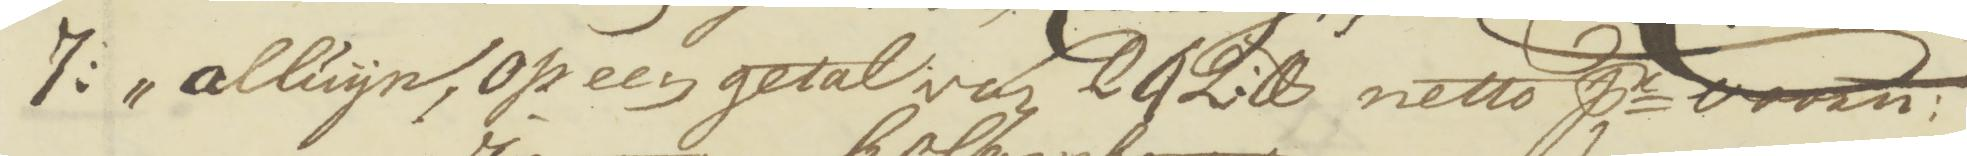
7: „ alluijn, op een getal van 242: lb netto p=r voorn:
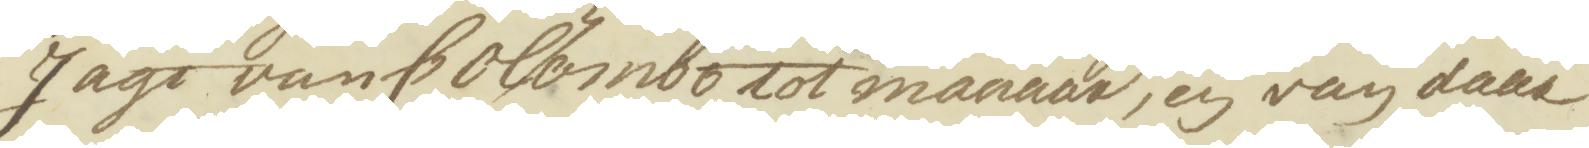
Jagt van Colombo tot manaar, en van daar
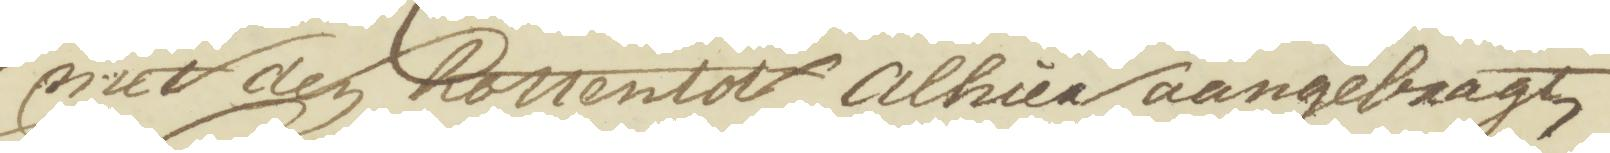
met den hottentot Alhier aangebragt,
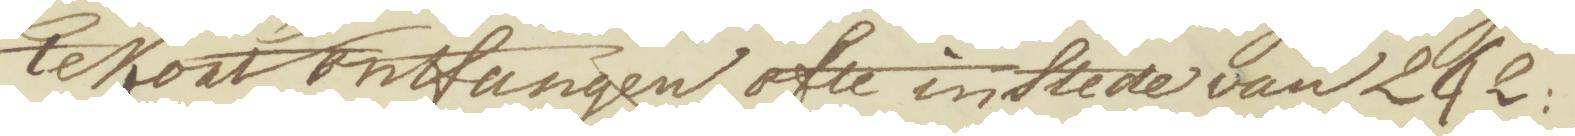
te kort ontfangen, ofte instede van 242:
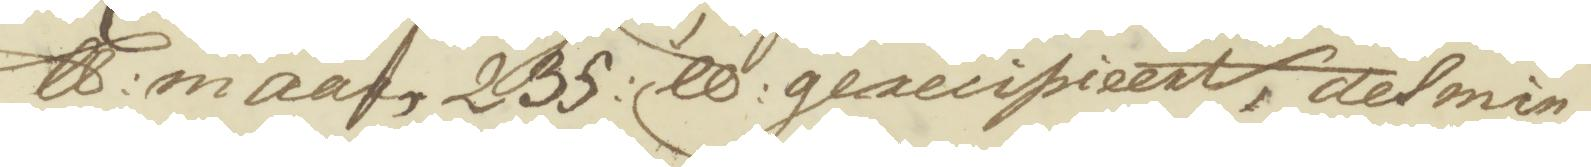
lb: maar, 235: lb: gerecipieert, des min
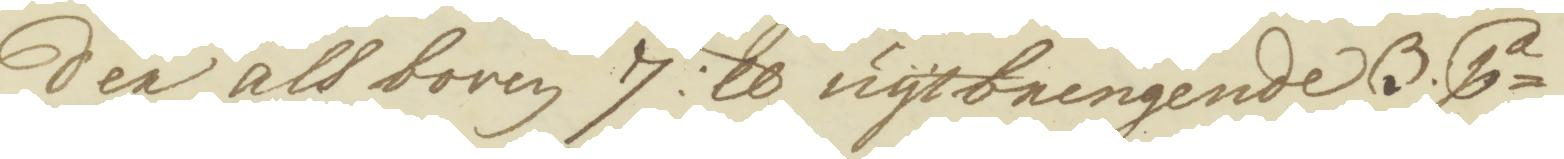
der als boven 7: lb uijtbrengende 3 p=r
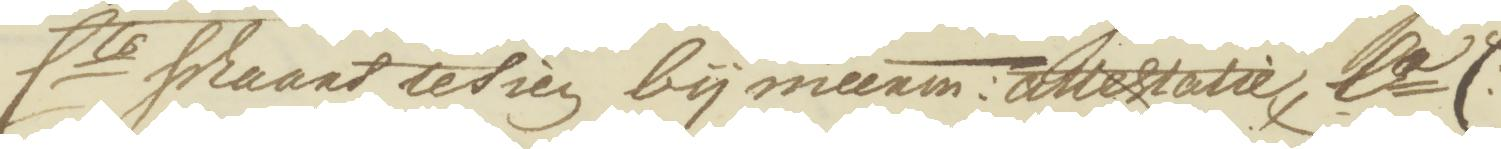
C=to schaars tesien bij meerm: attestatie, l=a C:
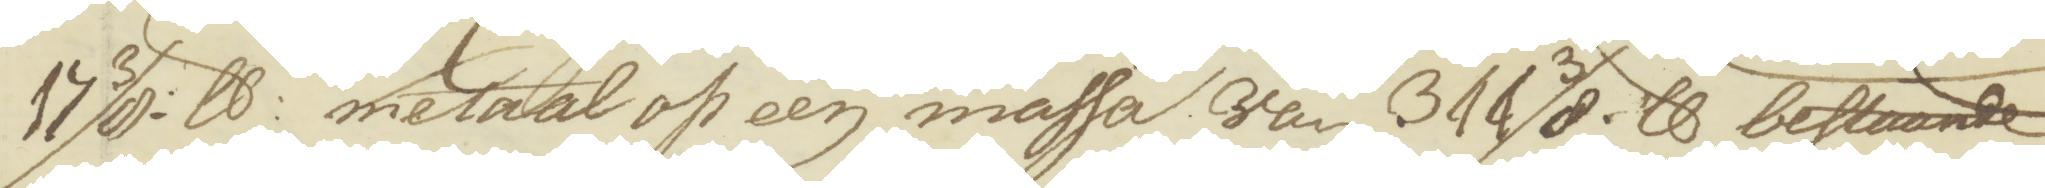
17 3/8: lb: metaal op een massa van 349 3/8. lb bestaande
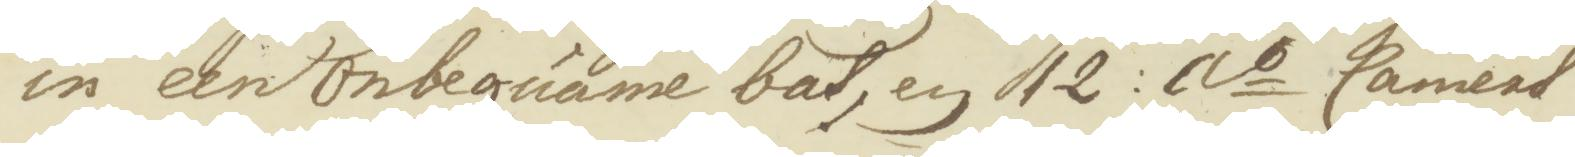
in een onbequame bas, en 12: a=o Camers
